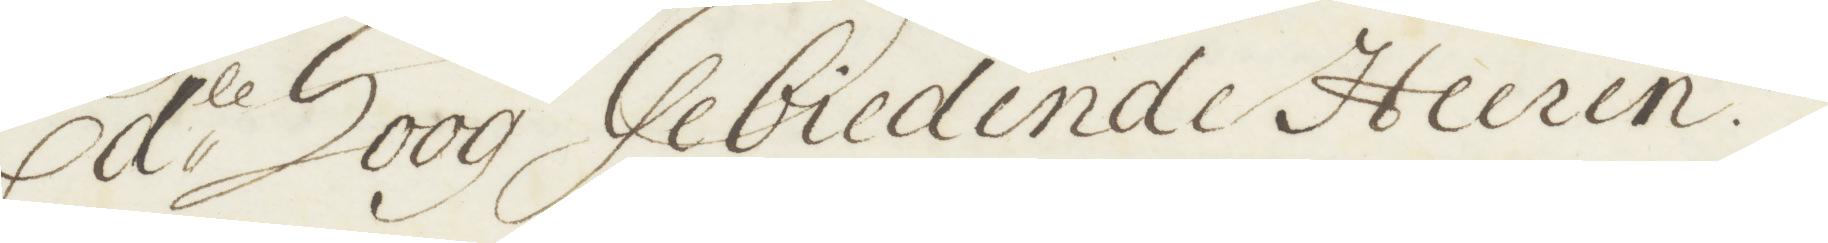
Ed„le Hoog Gebiedende Heeren.
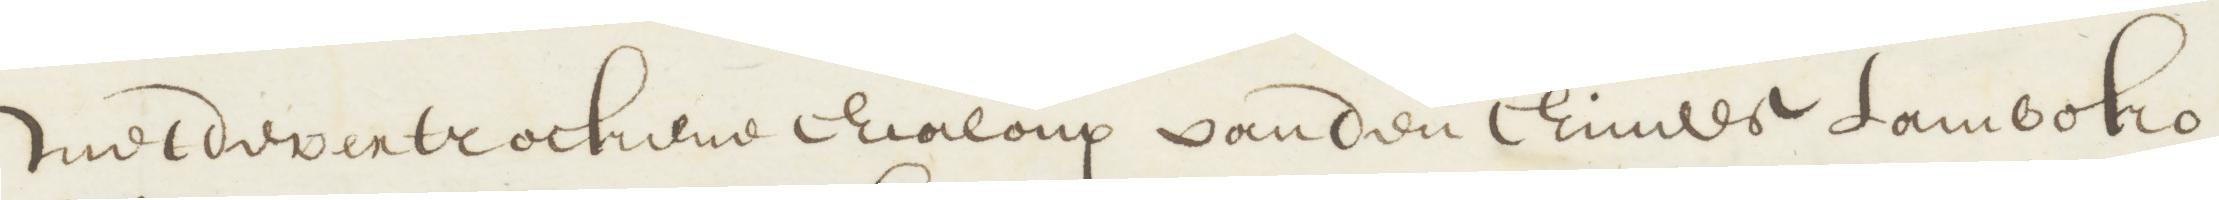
met de vertrockene chialoup van den Chinees tamboko
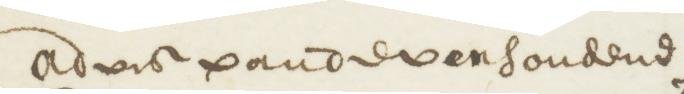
advis van de versondene
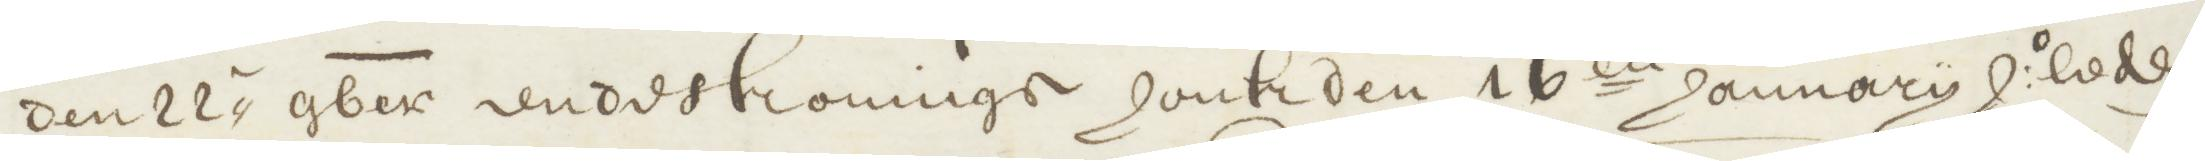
den 22„' 9ber en des konings jonk den 16=en januarij j:o leden
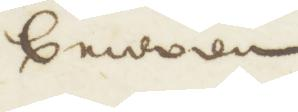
brieven
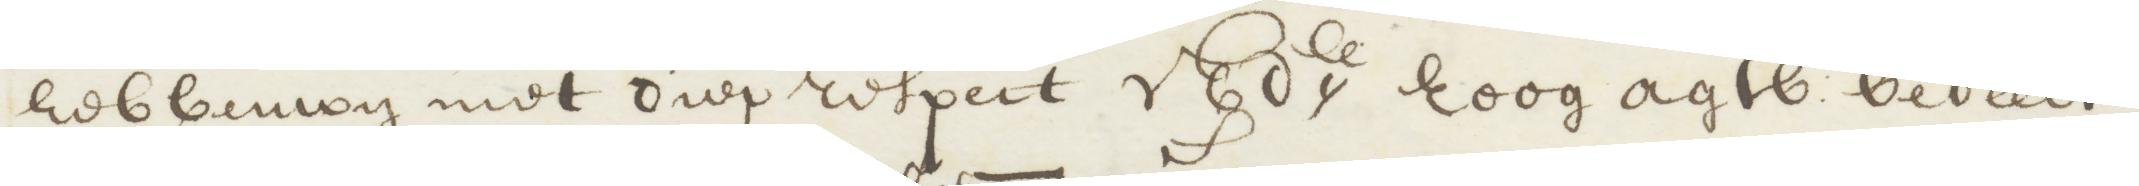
hebben wy met diep respect VEd„le hoog agtb: bedeelt
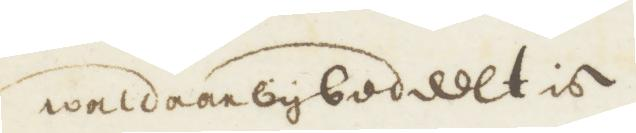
wat daar bij bedeelt is
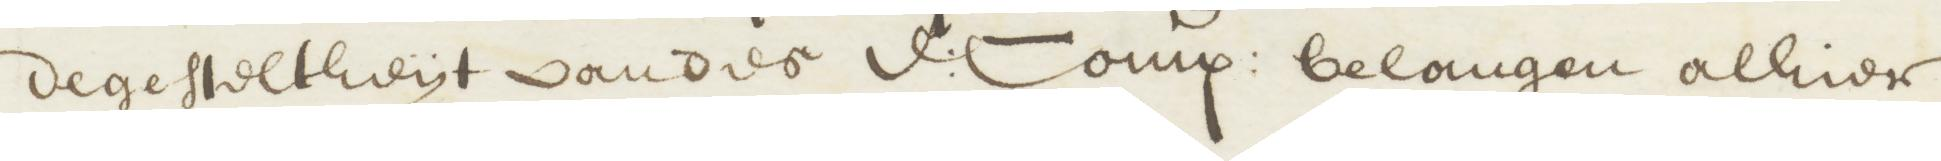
de gesteltheijt van des E: Comp:s belangen alhier
